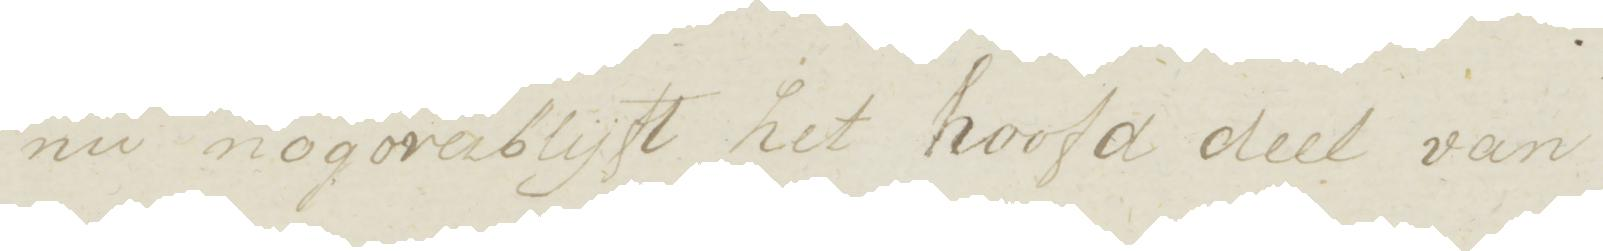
nu nog overblijft het hoofd deel van
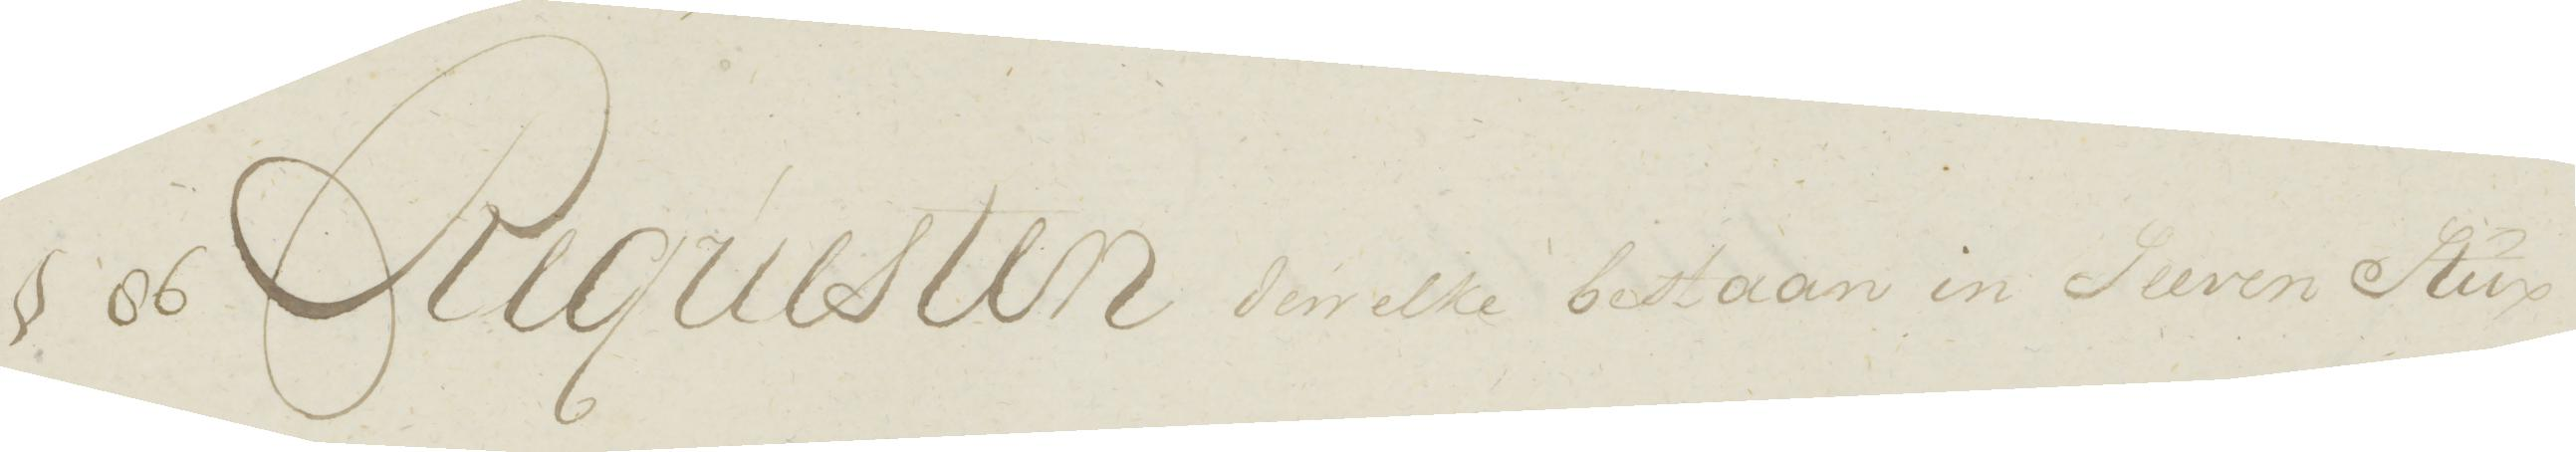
§ 86 Requesten dewelke bestaan in Seeven Stux
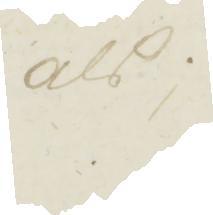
als;
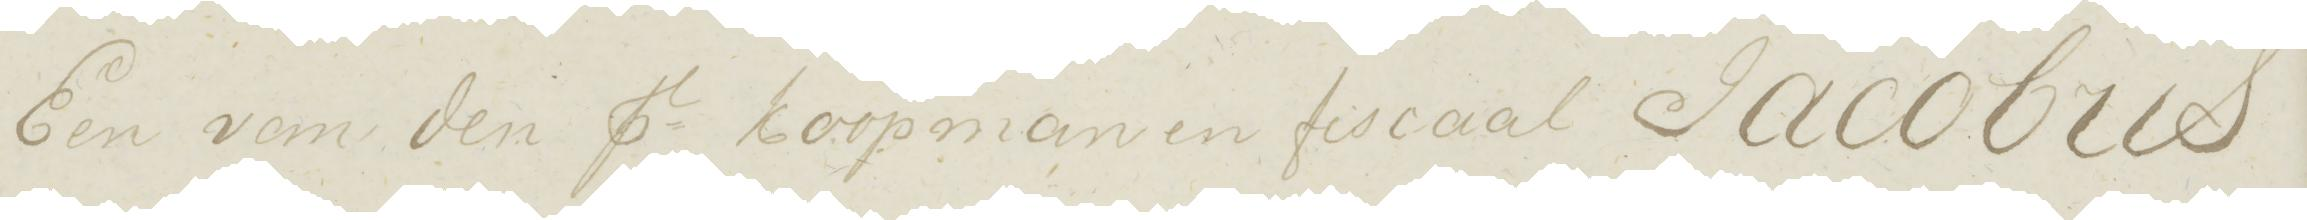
Een van den p=l koopman en fiscaal Iacobus
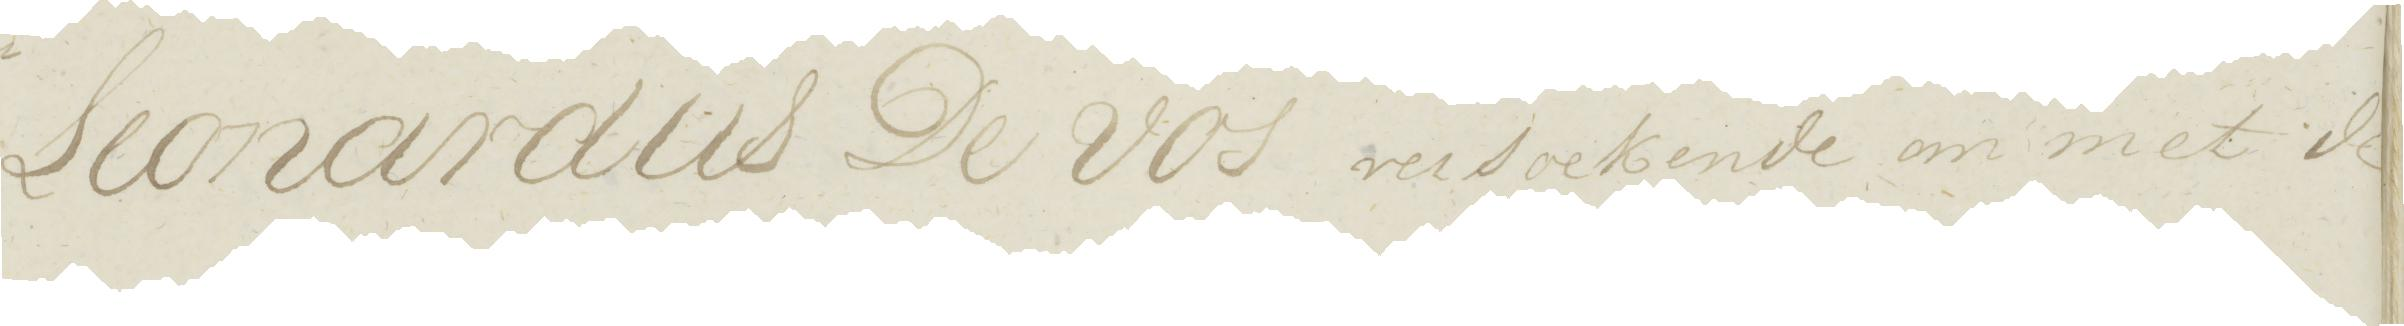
Leonardus De Vos versoekende om met de
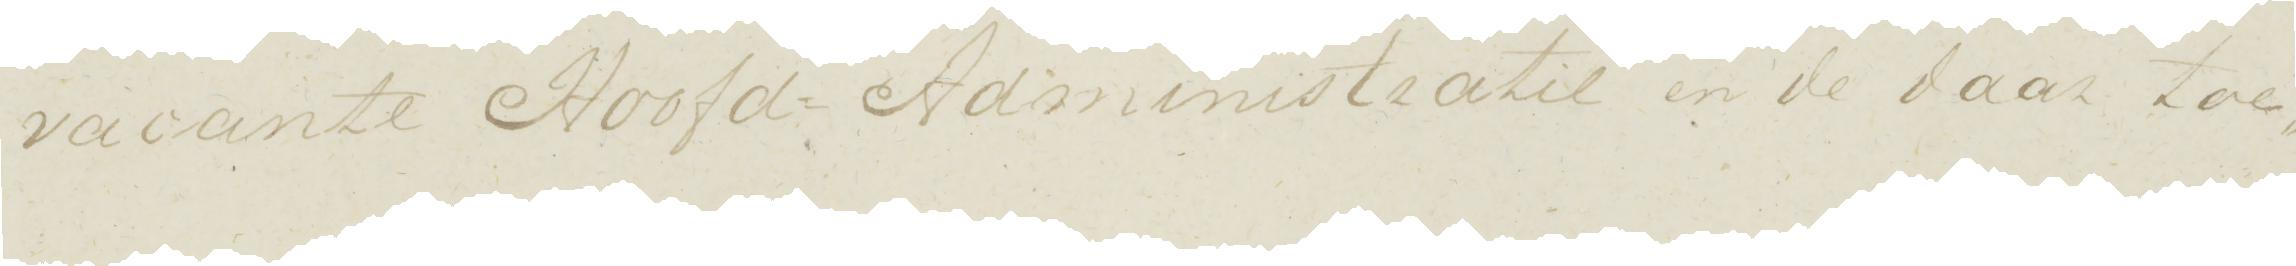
vacante Hoofd= Administratie en de daar toe
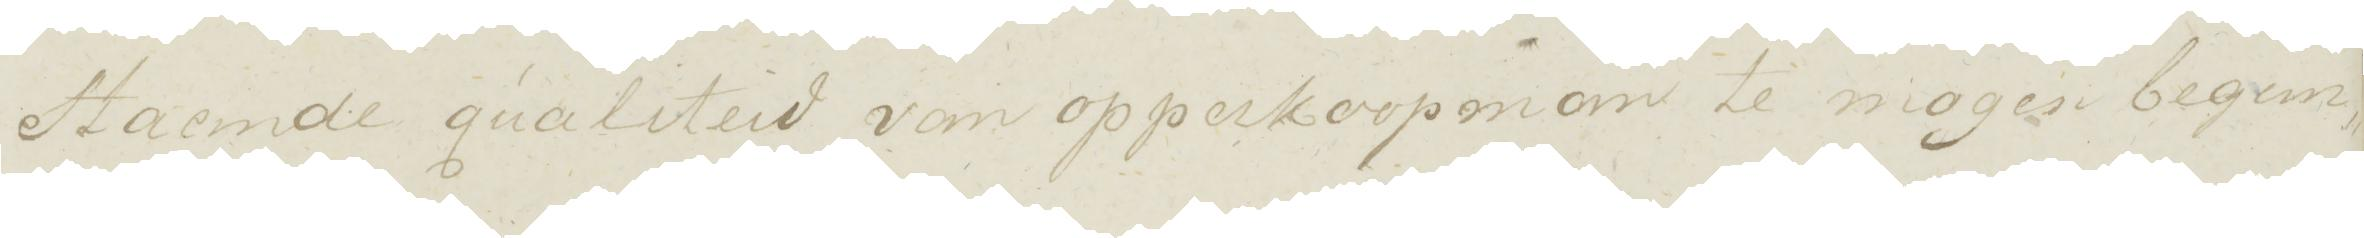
staande qualiteid van opperkoopman te mogen begun
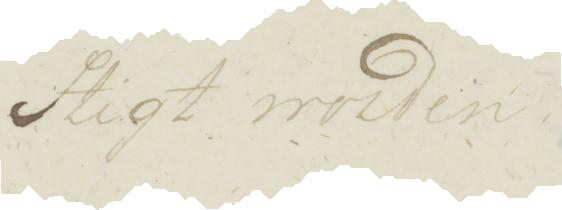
stigt worden
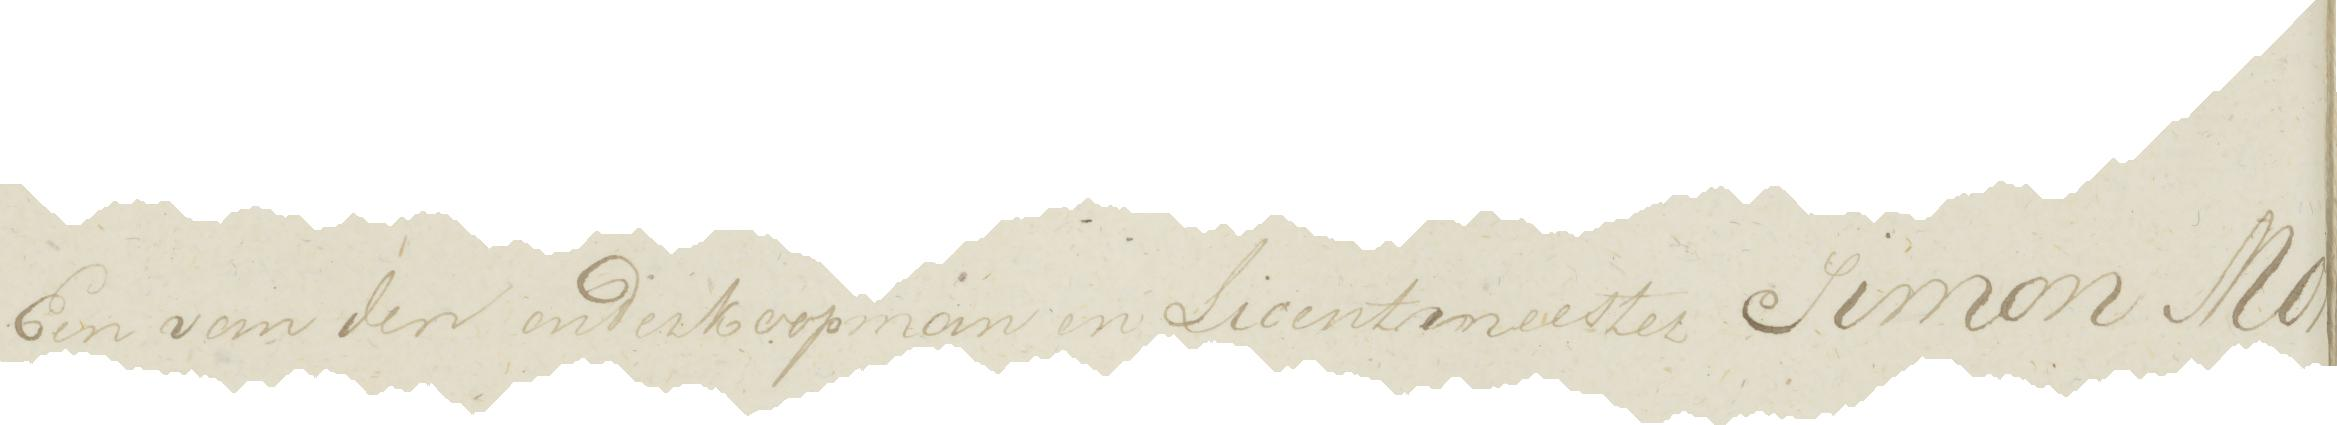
Een van den onderkoopman en Licentmeeste Simon Mo
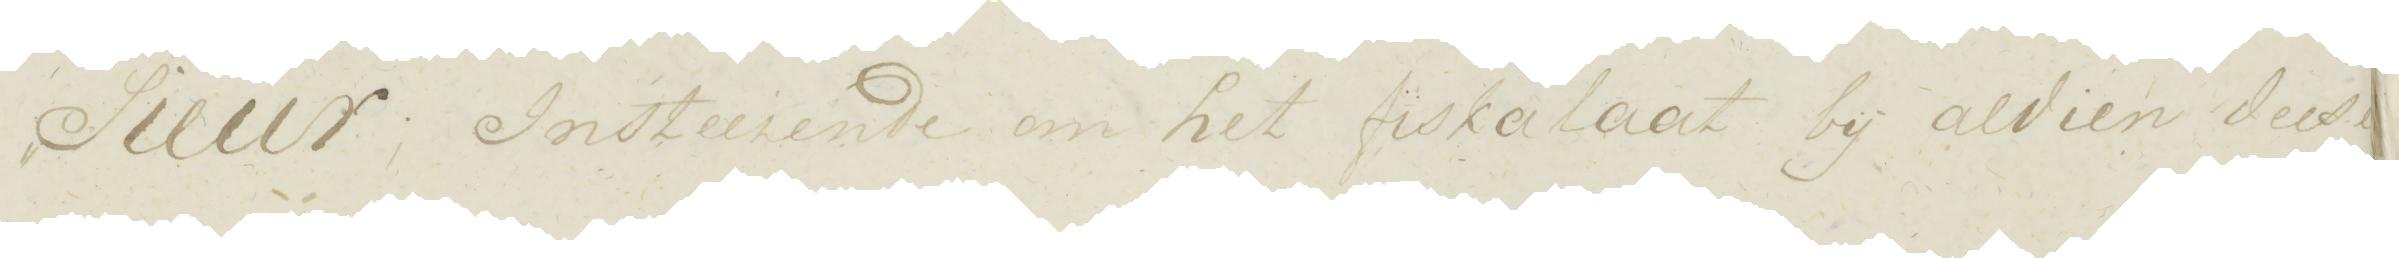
sieur; Insteerende om het fiskalaat bij aldien deese
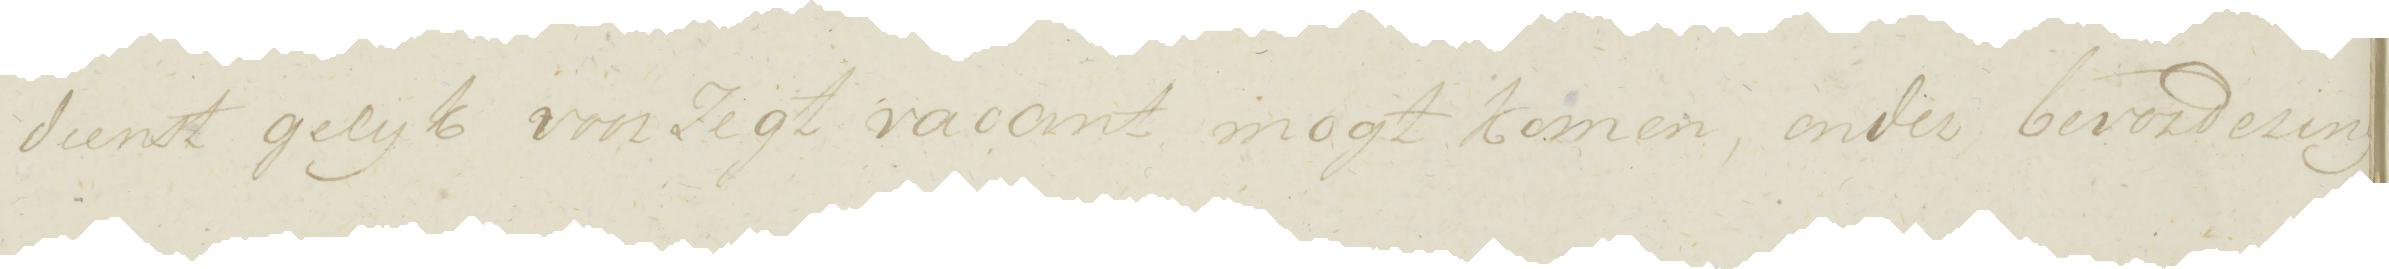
dienst gelijk voorzegt vacant mogt komen, onder bevorderin
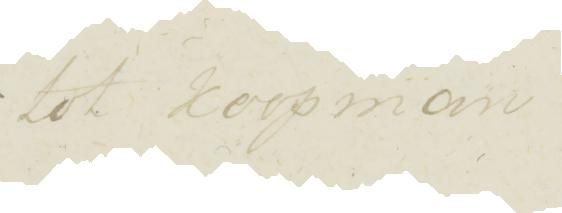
tot koopman
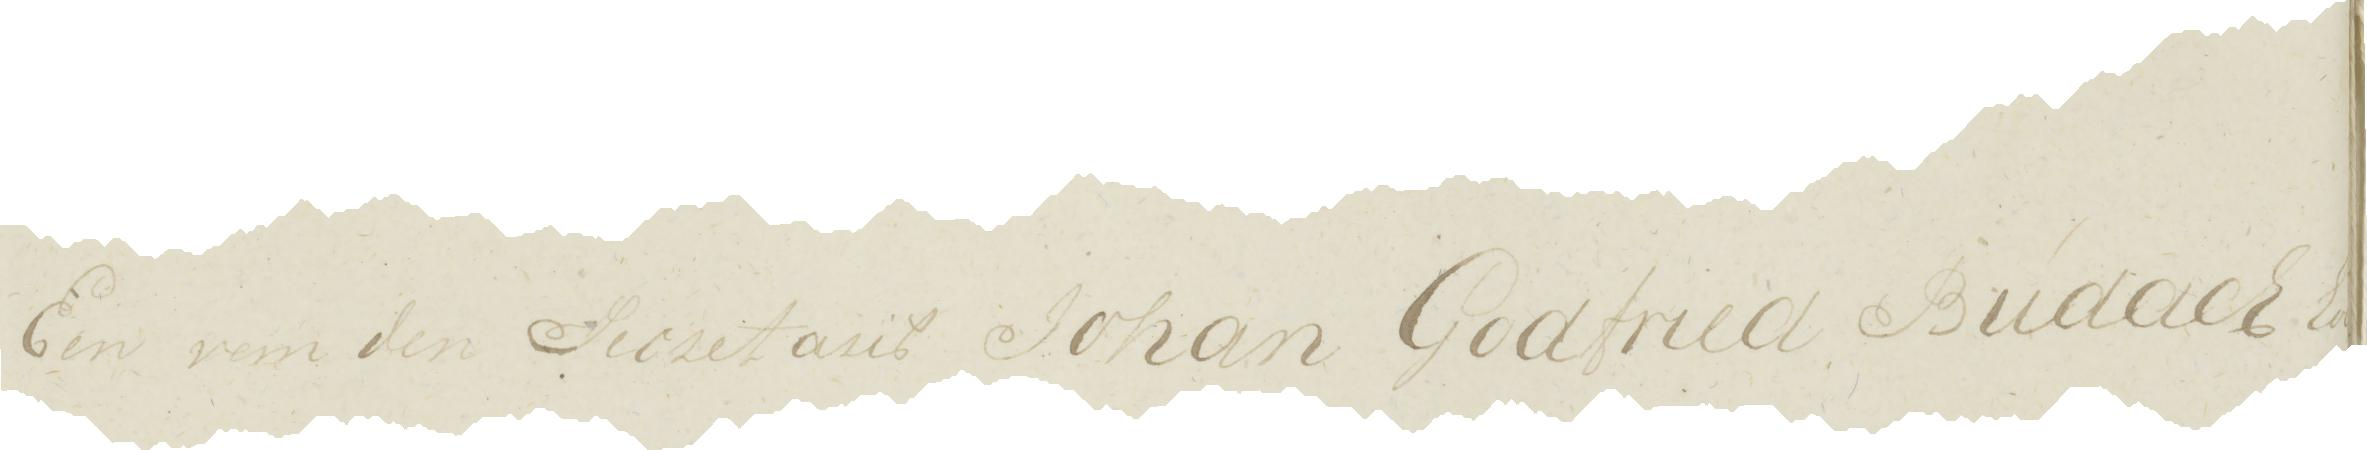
Een van den Secretaris Iohan Godfried Budach la
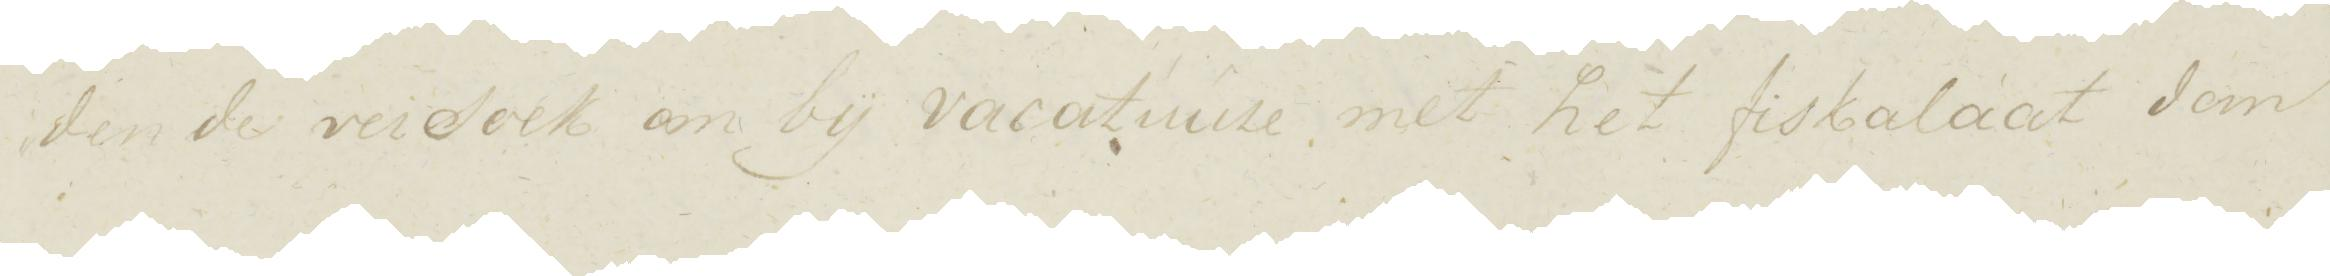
„den de versoek om bij vacatuure met het fiskalaat dan
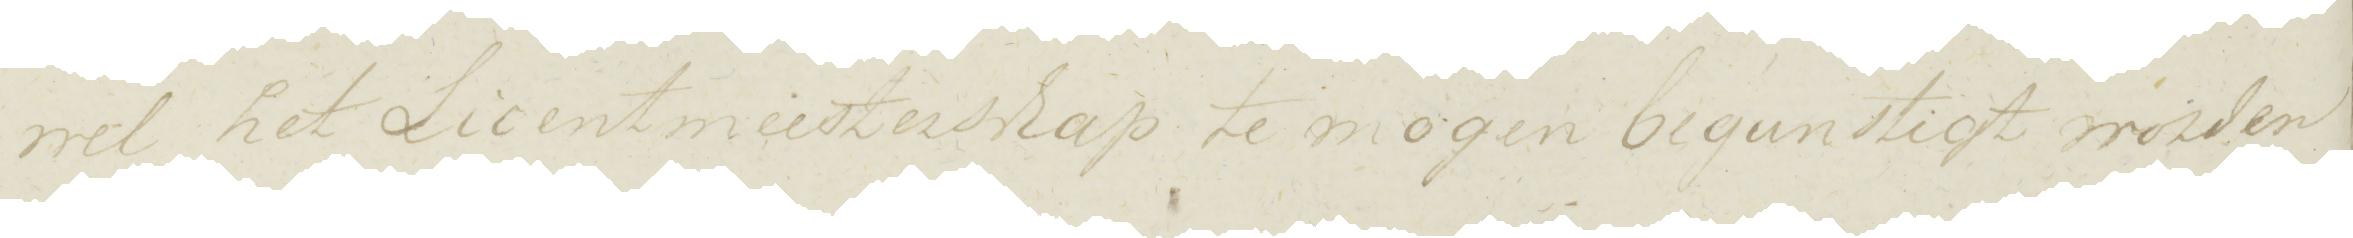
wel het Licentmeesterschap te mogen begunstigt worden
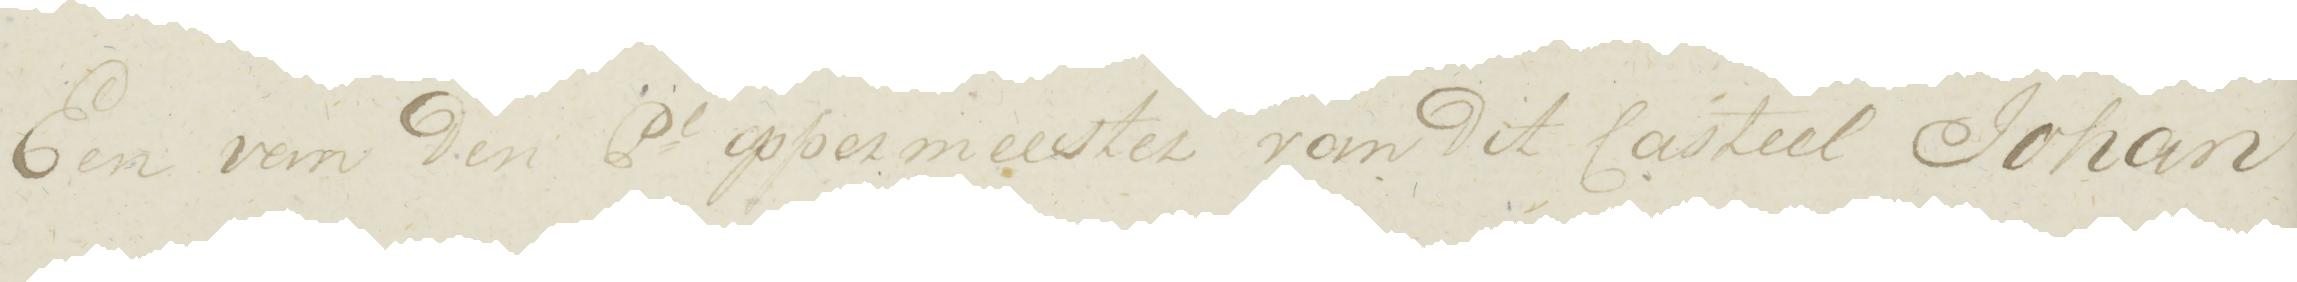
Een van den P=l oppermeester van dit Casteel Iohan
